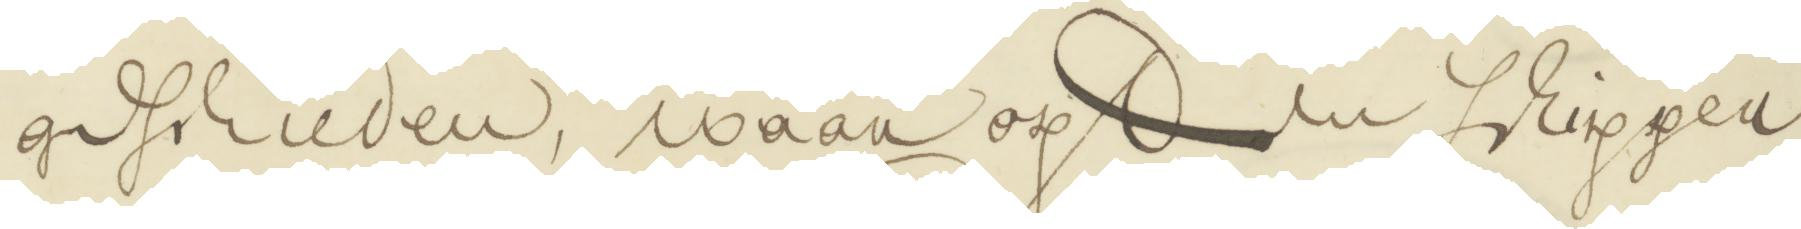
geschieden, waar op den schipper
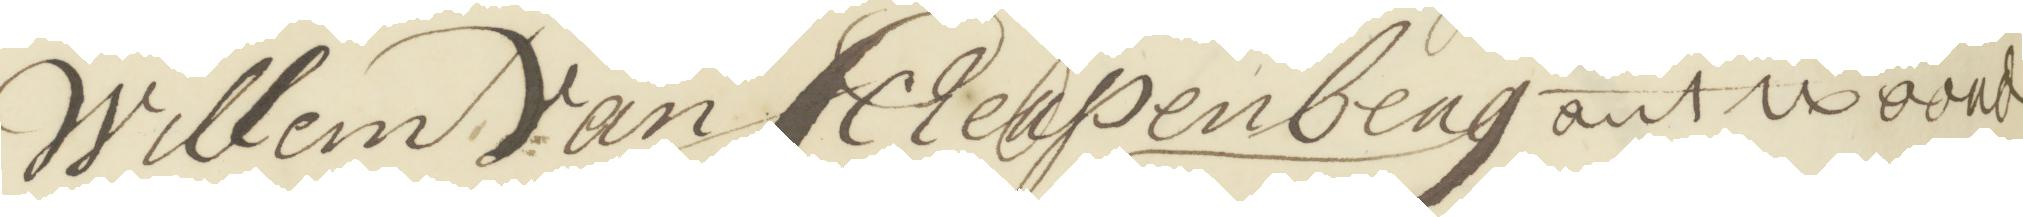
Willem van Scherpenberg antwoorde
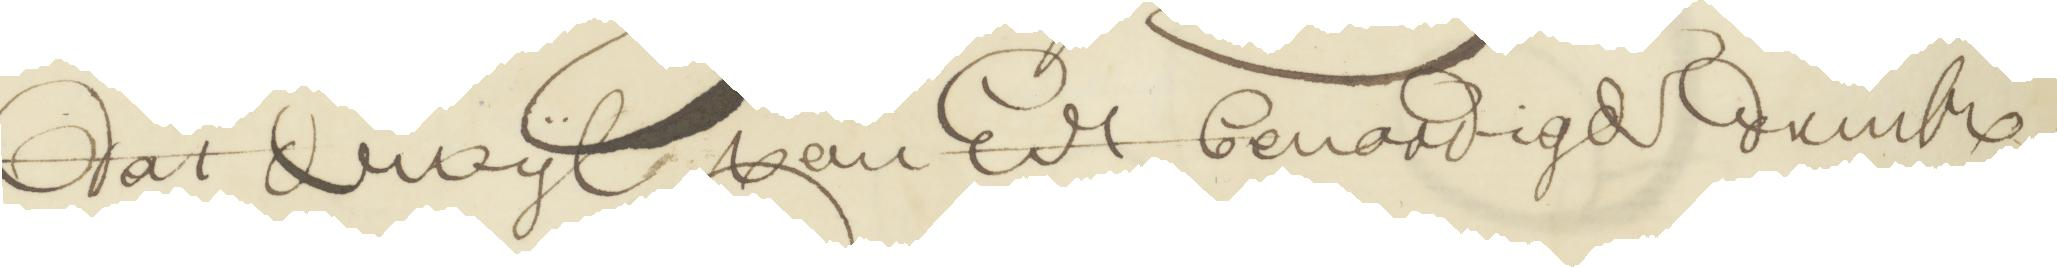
dat dewijl van het benoodigde drink
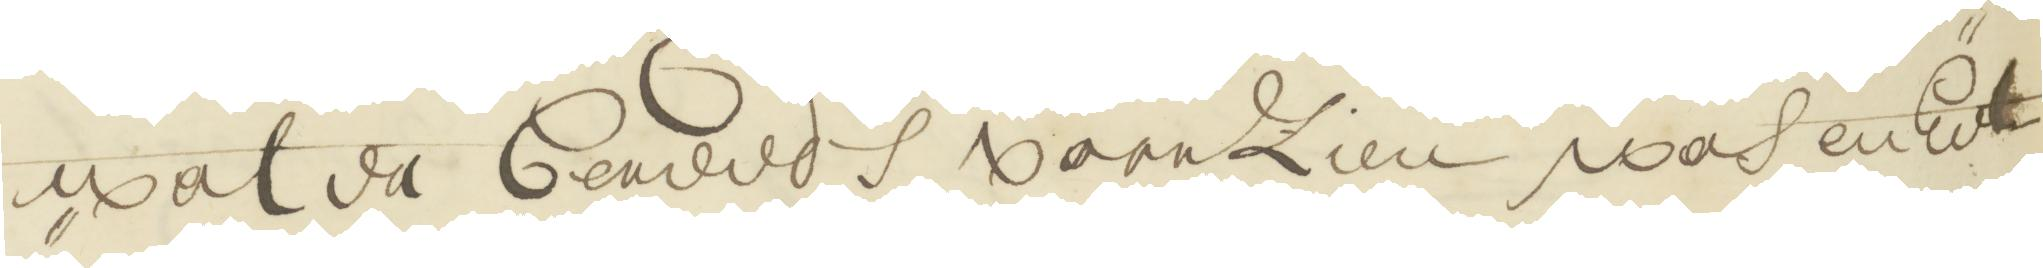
„water bereeds voorzien was en het
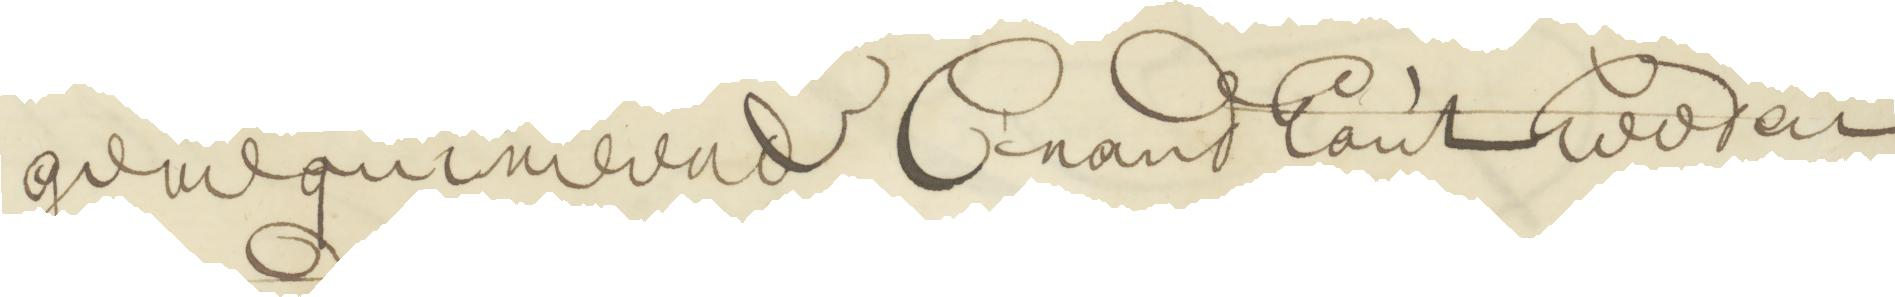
gerequireerde brandhout heeden
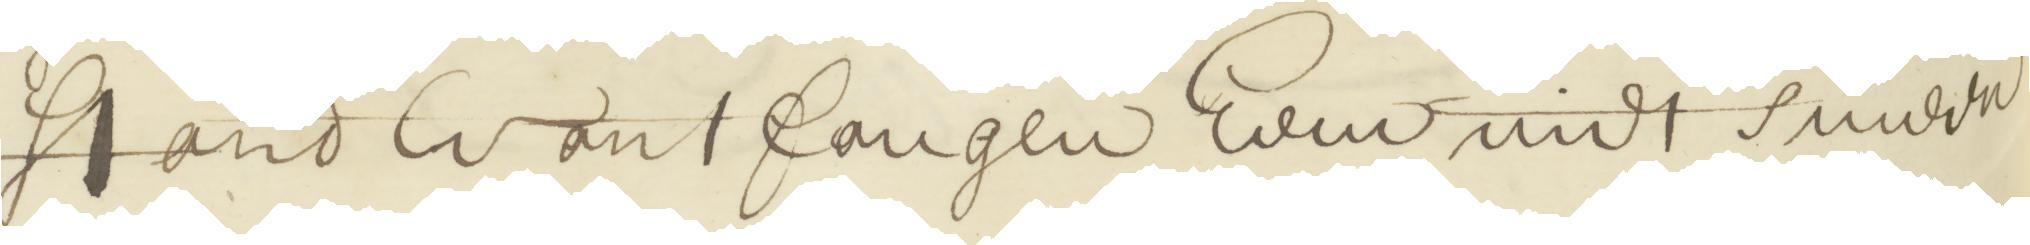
stond te ontfangen hem niets meer
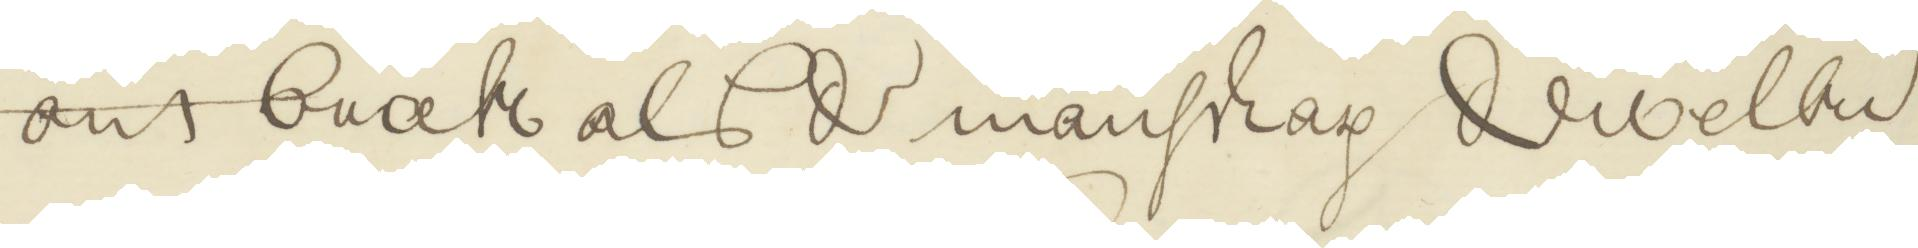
ontbrak als de manschap dewelke
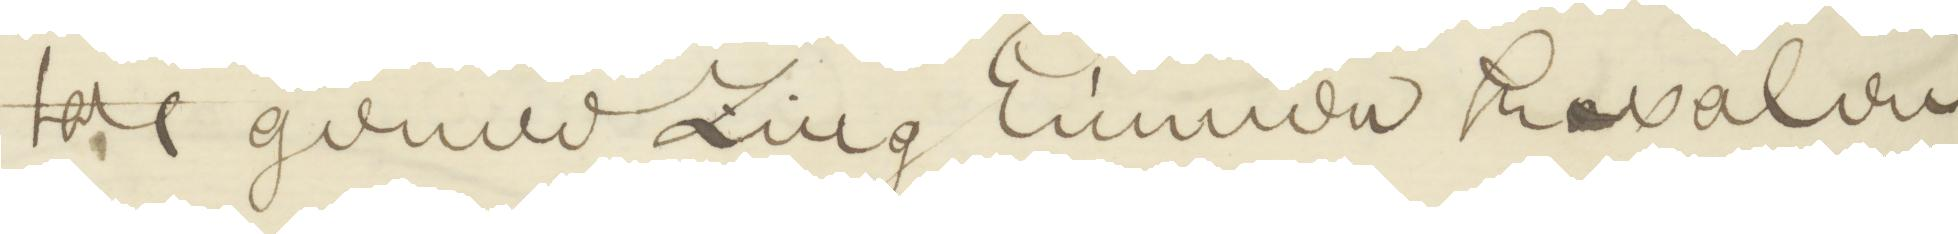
tot geneezing hunner kwalen
